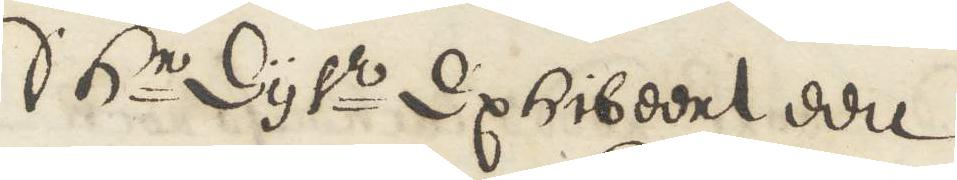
d’ H=r Eijs=s Exhibeert een
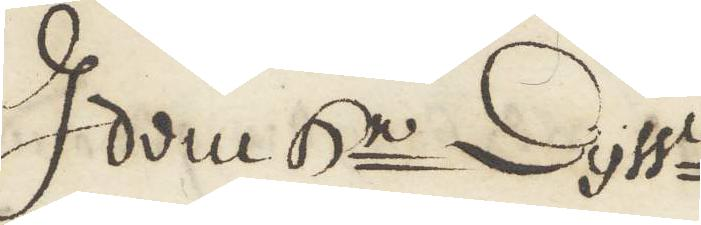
Jdem h=r Eijss=r
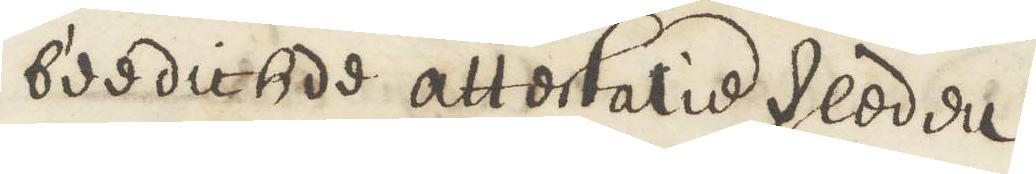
b'eedichde attestatie verleden
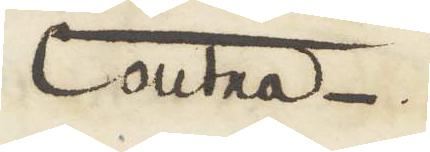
Contra -
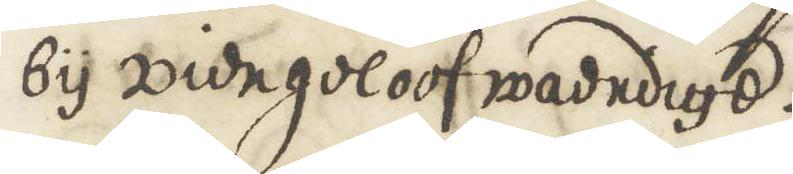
bij vier geloofwaerdige
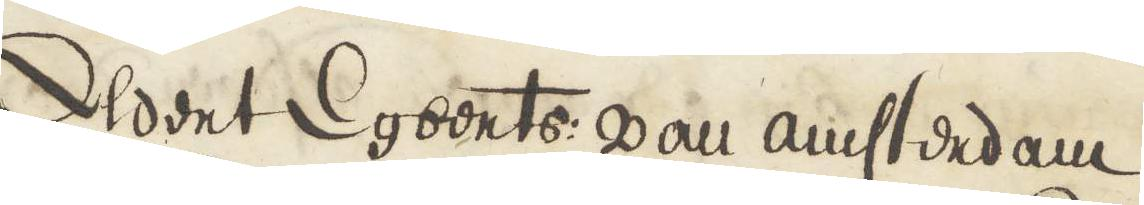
Aldert Egberts: van amsterdam
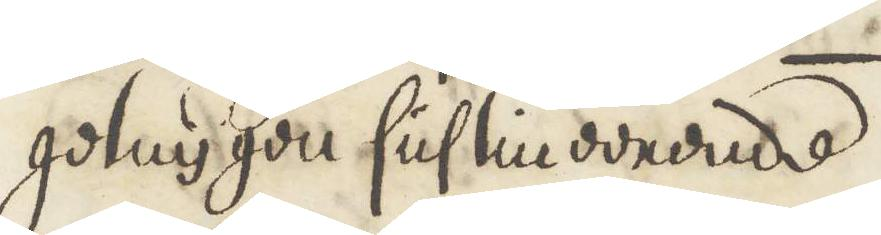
getuijgen sustineerende
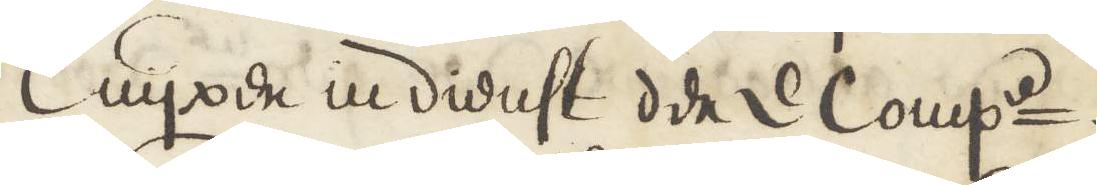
Cuijper in dienst der E Comp=e
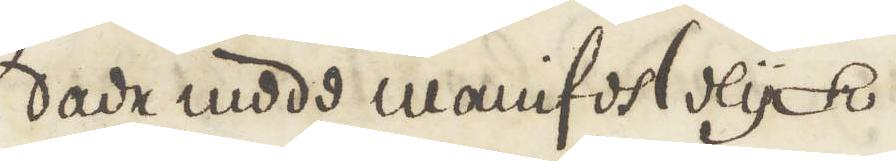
daer mede manifestelijck
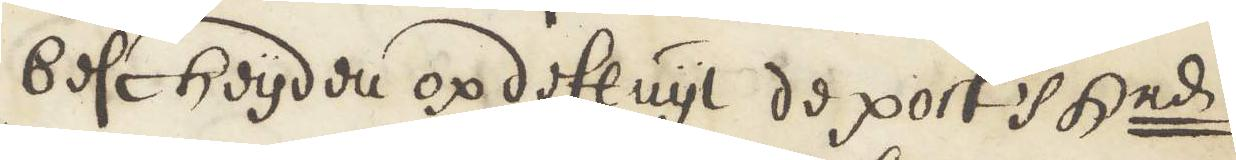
bescheijden op de fluijt de post 's h=re
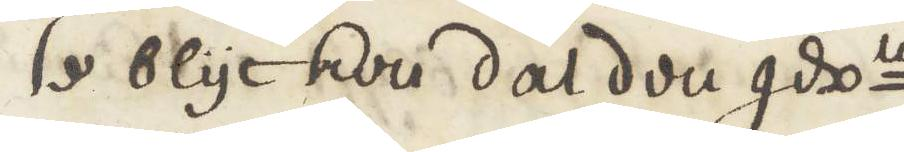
te blijcken dat den gev=n
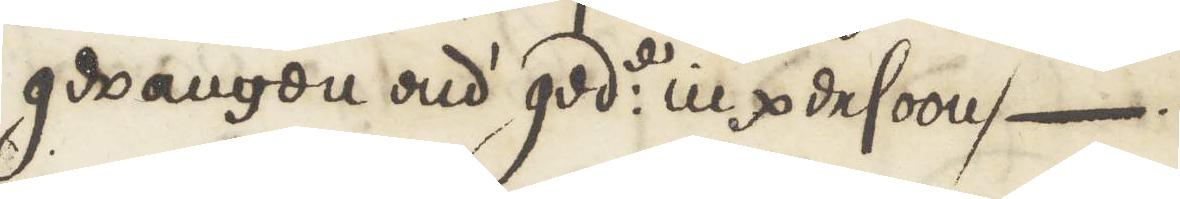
gevangen end’ ged:e in persoon/—.
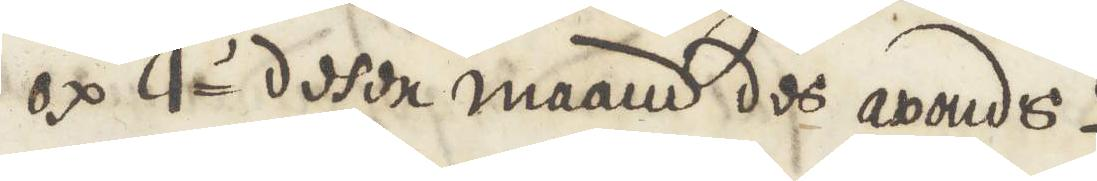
op 4=' deser maand des avonds
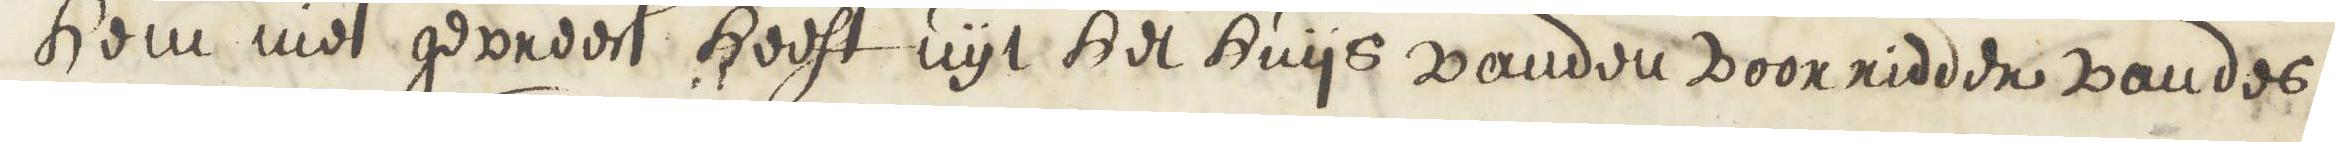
hem niet gevreest heeft uijt het huijs vanden voor ridder van des
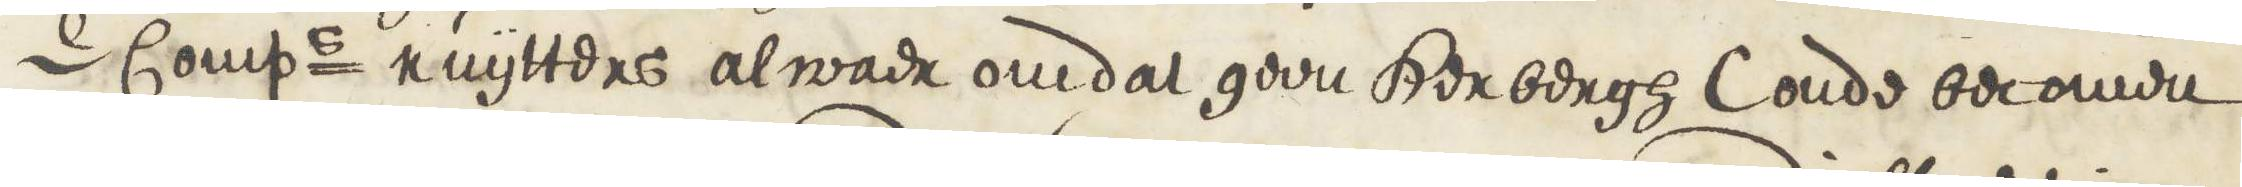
E Comp=e ruijtters alwaer om dat geen herbergh Conde becomen
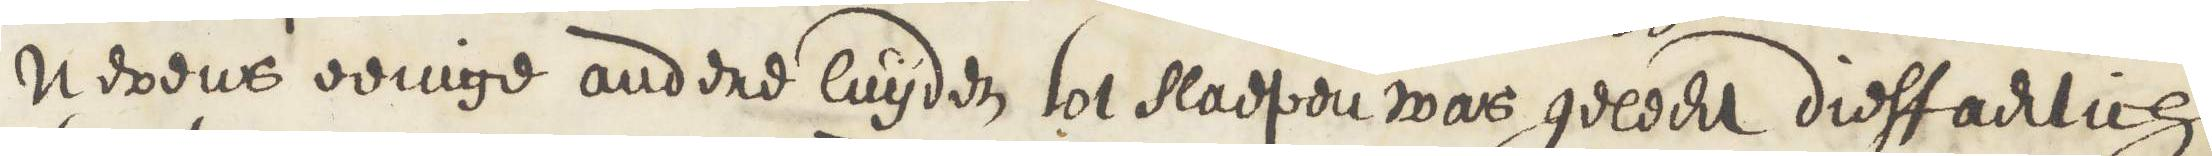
nevens eenige andere luijden tot slaepen was gelecht dieffachtich
